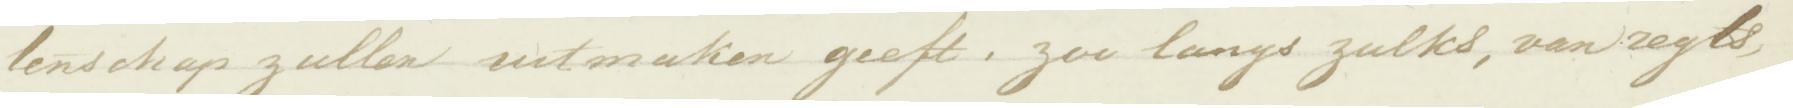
tenschap zullen uitmaken geeft, zoo langs zulks, van regts,
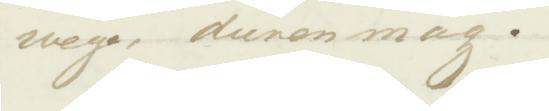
wegen duren mag.
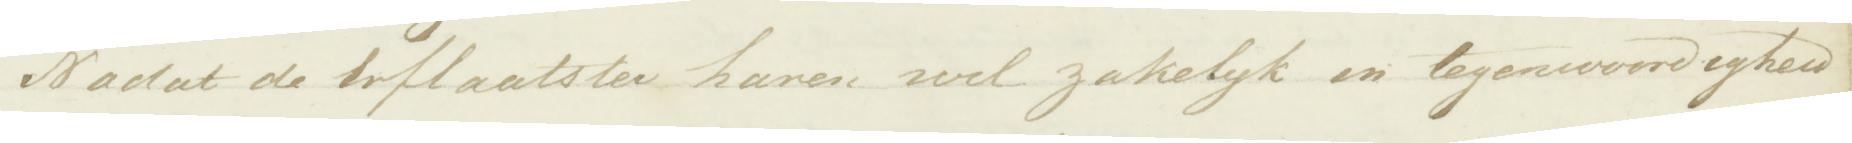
Nadat de Erflaatster haren wil zakelyk in tegenwoordigheid
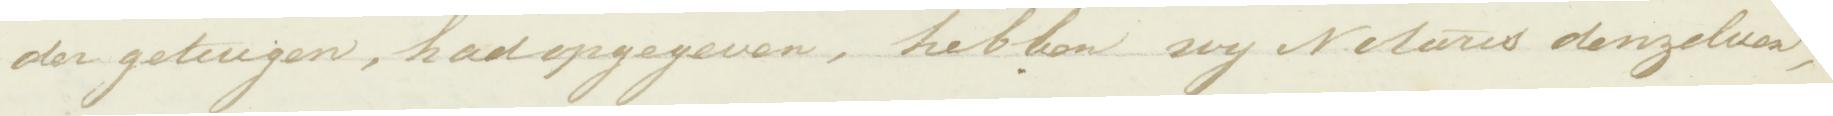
der getuigen, had opgegeven, hebben wy Notaris denzelven,
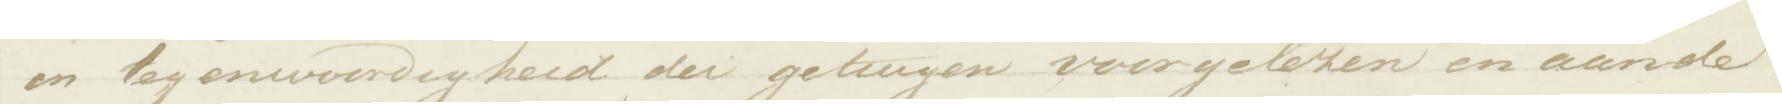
in tegenwoordigheid der getuigen voorgelezen en aan de
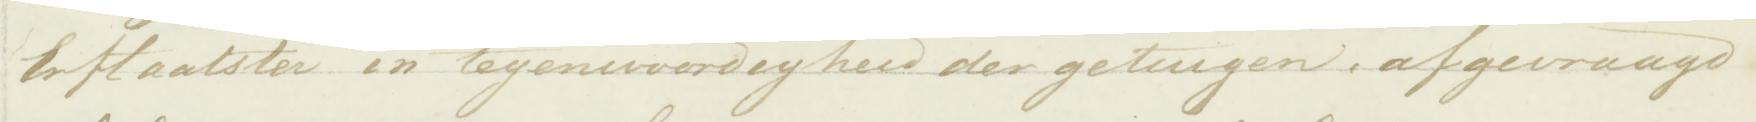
Erflaatster in tegenwoordigheid der getuigen, afgevraagd
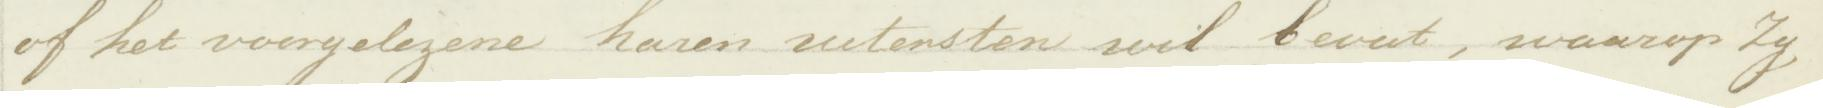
of het voorgelezene haren uitersten wil bevat, waarop zy
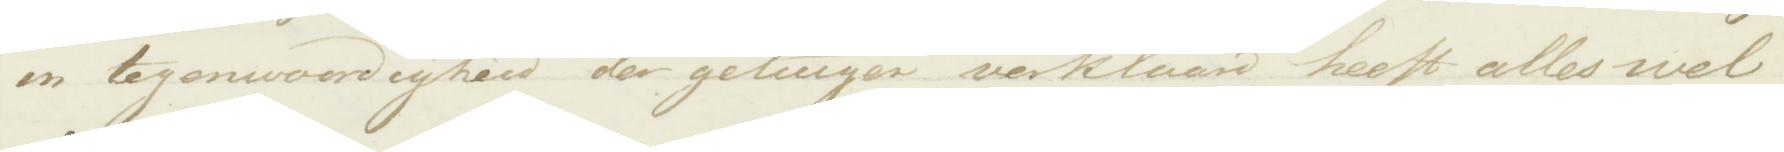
in tegenwoordigheid der getuigen verklaard heeft alles wel
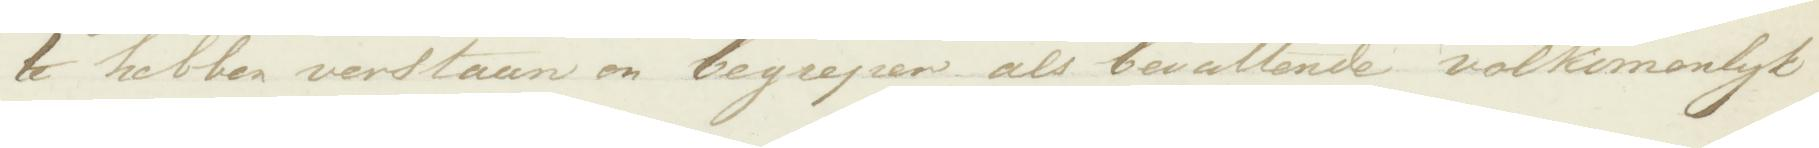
te hebben verstaan en begrepen als bevaltende volkomenlyk
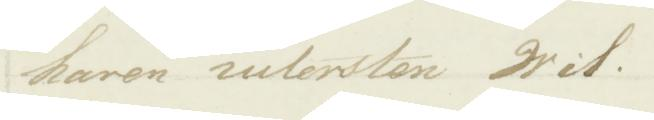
haren uitersten Wil.
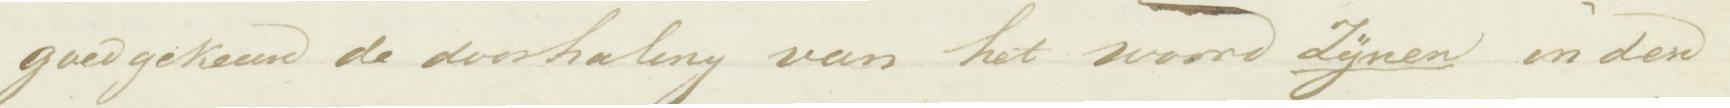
goedgekeurd de doorhaling van het woord zijnen in den
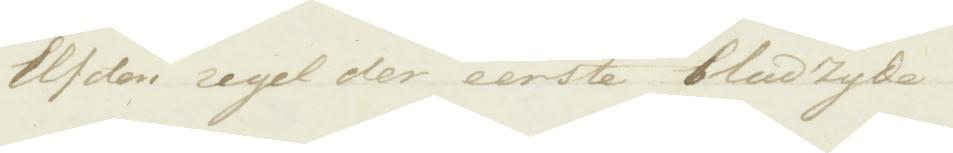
Elfden regel der eerste bladzyde
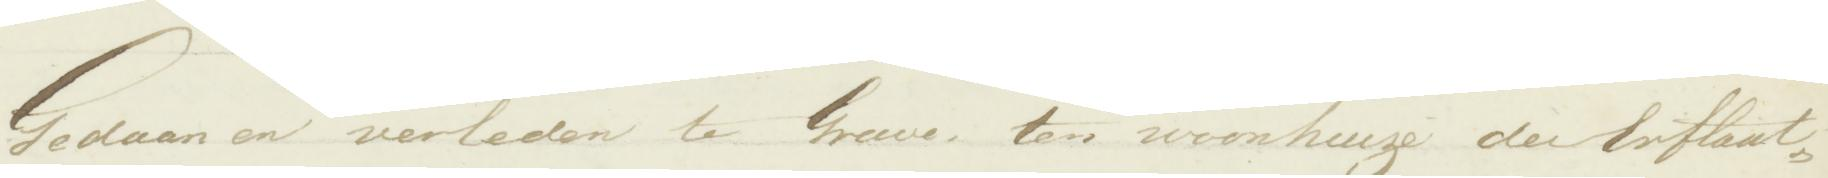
Gedaan en verleden te Grave, ten woonhuize der Erflaat„
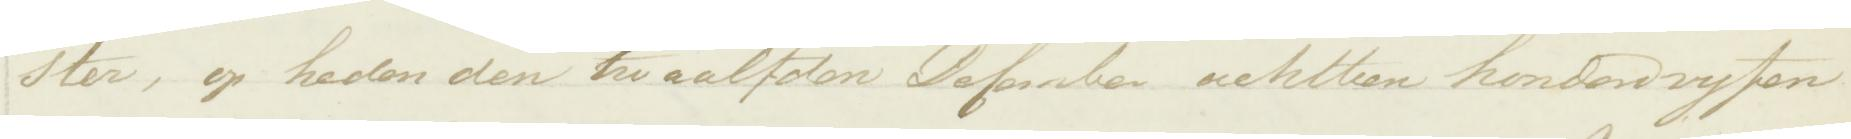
ster, op heden den twaalfden December achttien honderd vyfen
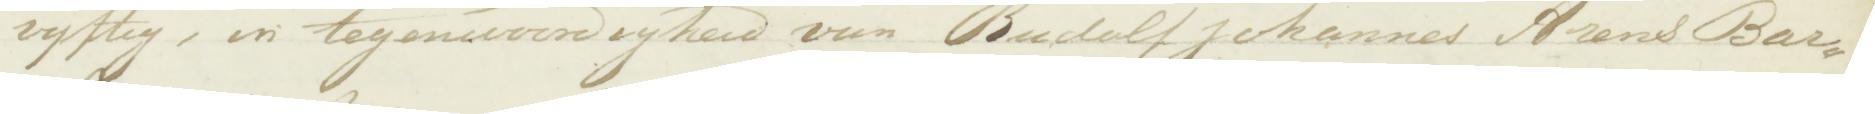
vyftig, in tegenwoordigheid van Rudolf Johannes Arens Bar„
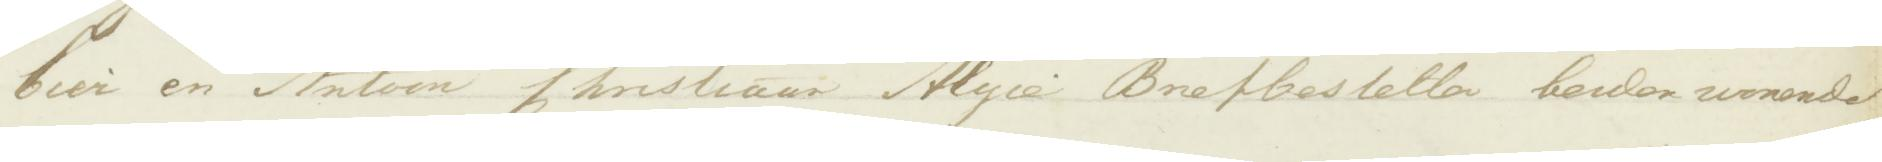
bier en Antoon Christiaan Algie Briefbesteller beiden wonende
